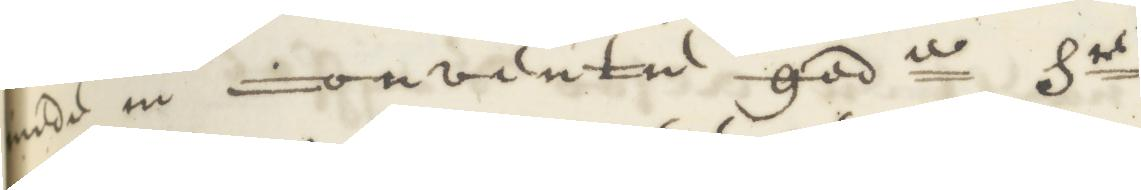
nede in conventie ged=e h=r
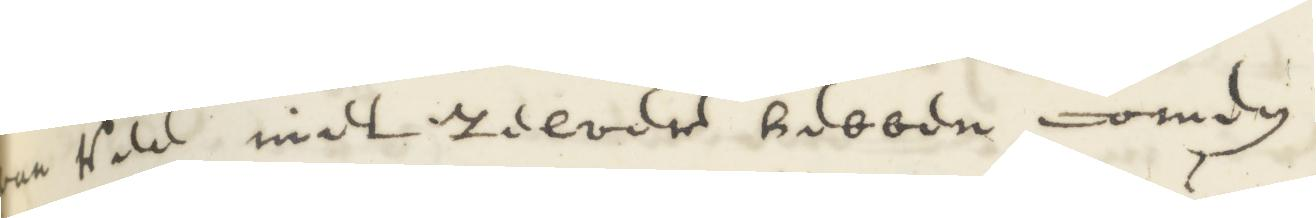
van Ree niet zelver hebben comen
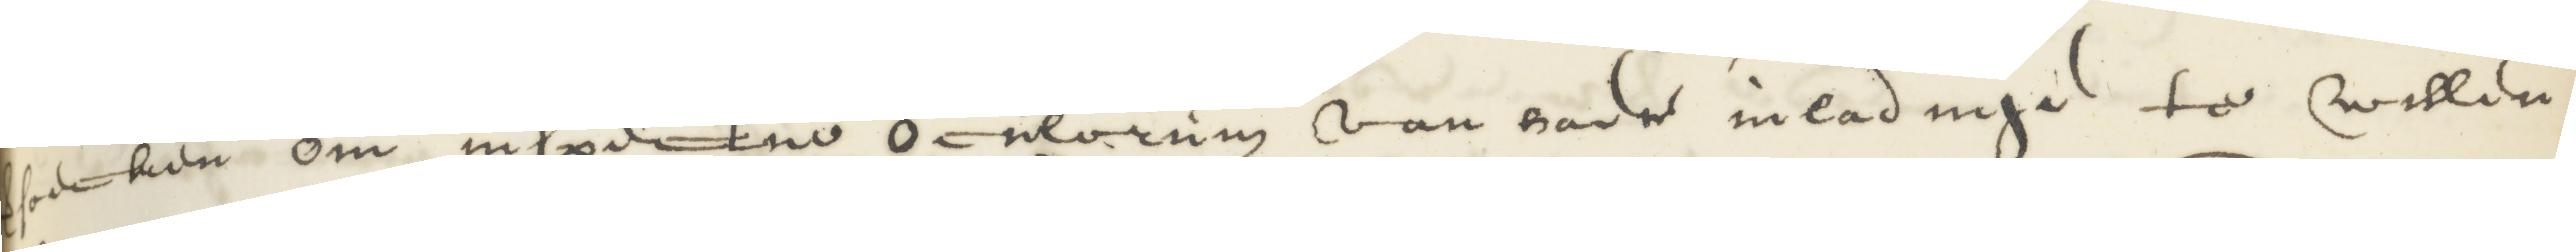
versoecken om inspectie oculerum van haer inladinge te willen
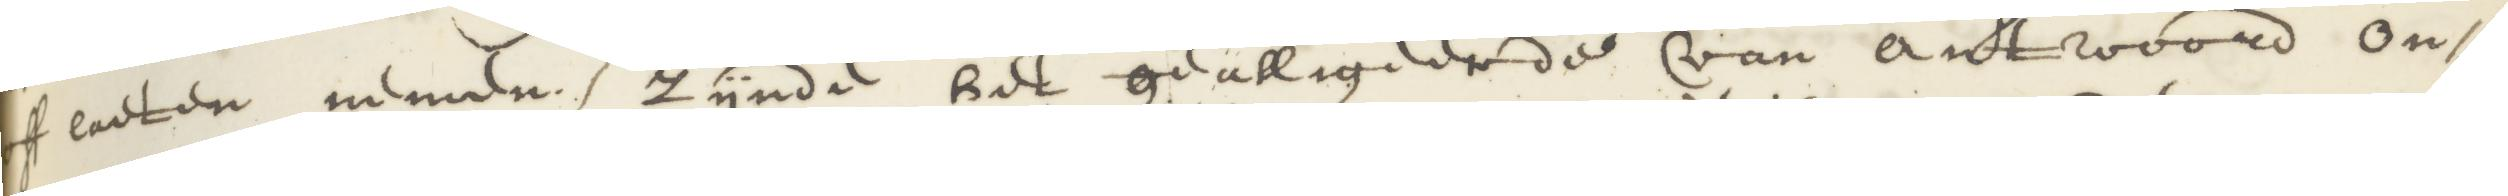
off laeten nemen, zijnde het gealligeerde van antwoord on„
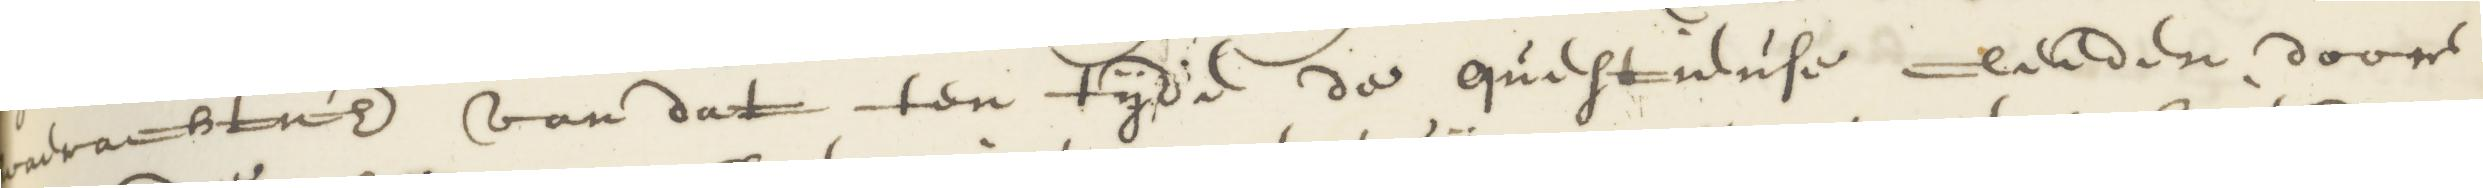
waerachtich van dat ten tijde de questieuse cleeden door
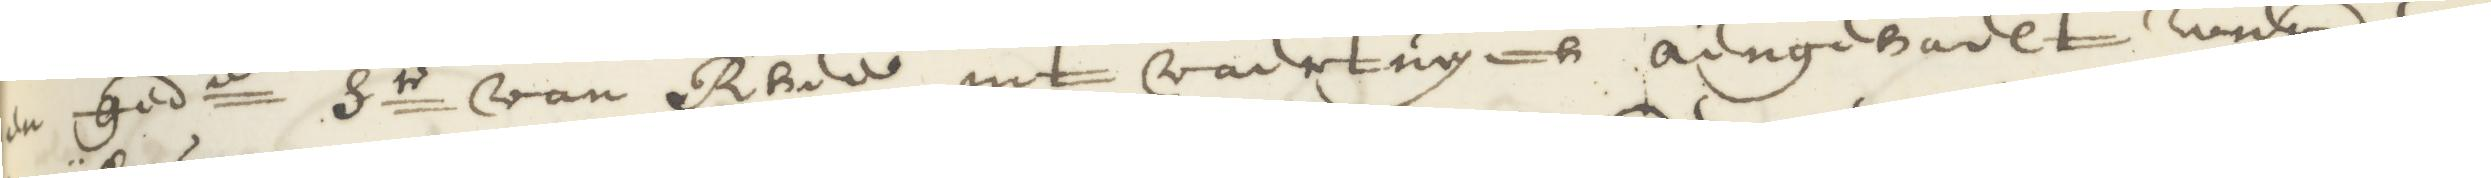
ged=te h=r van Rhee int vaertuijch aengehaelt wierden
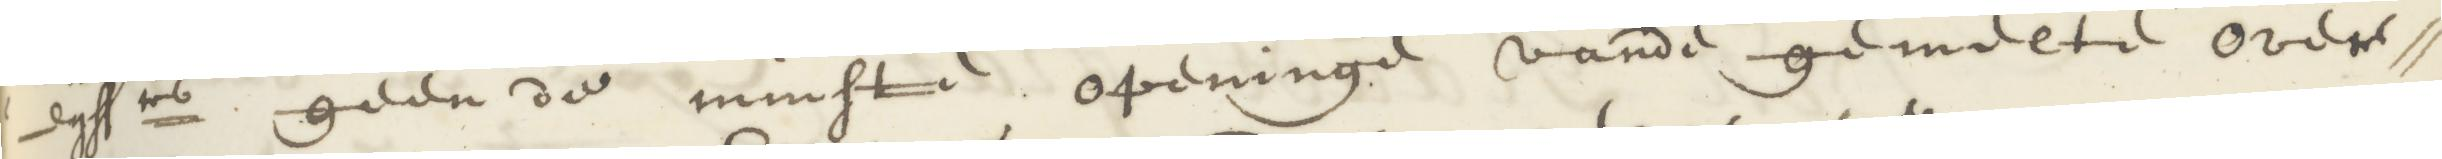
eijss=rs geen de minste openinge vande gemelte over„
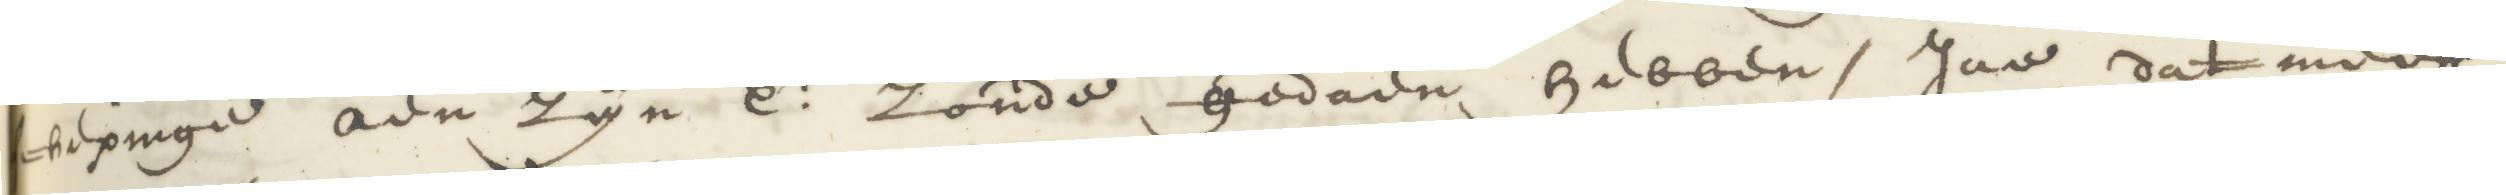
chepinge aen zijn E: zoude gedaen hebben, Jae dat meer
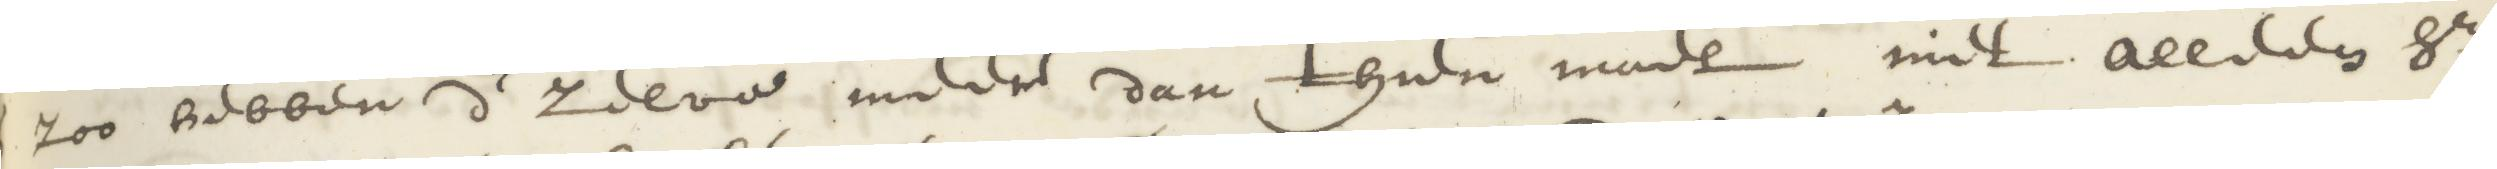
zoo hebben d’ zelve meer dan thien mael niet alleen h=r
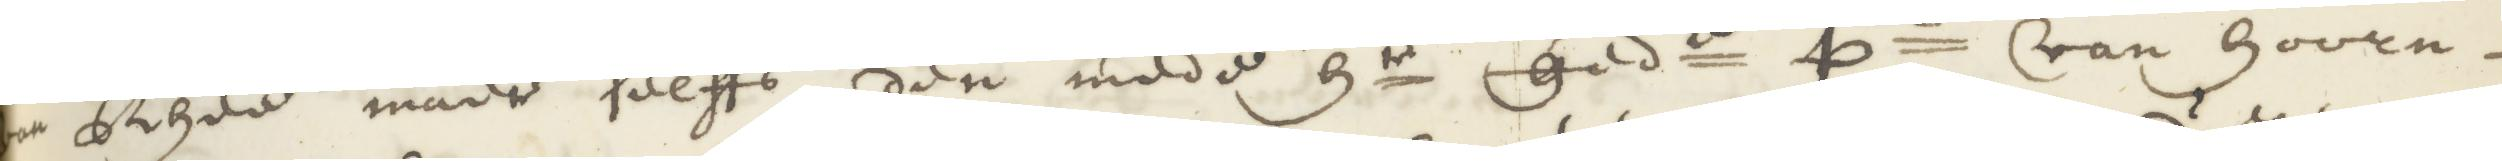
an Rhee maer selffs den mede h=r ged=e p=r van hoorn
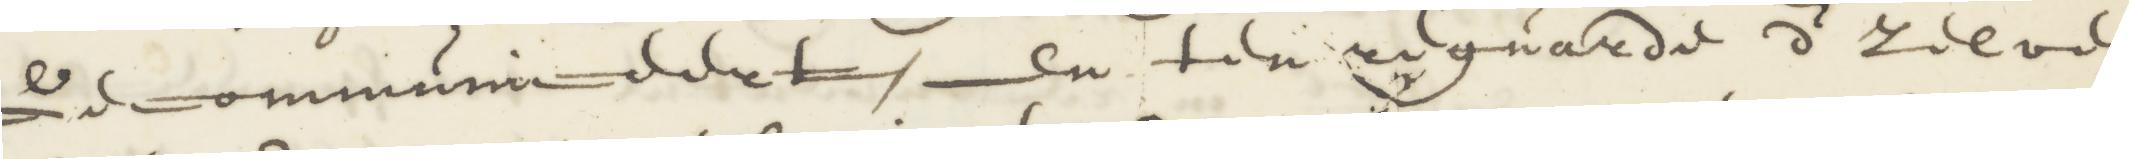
gecommuniceert, en ter reguarde d’ zelve
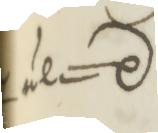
ulx
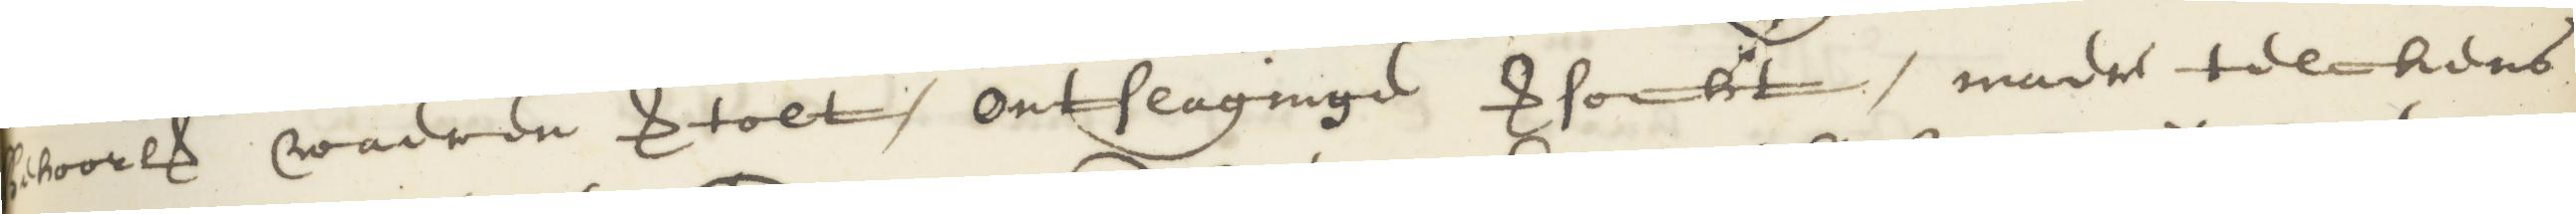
ehoorlijk waeren vertolt, ontslaginge versocht, maer telckens
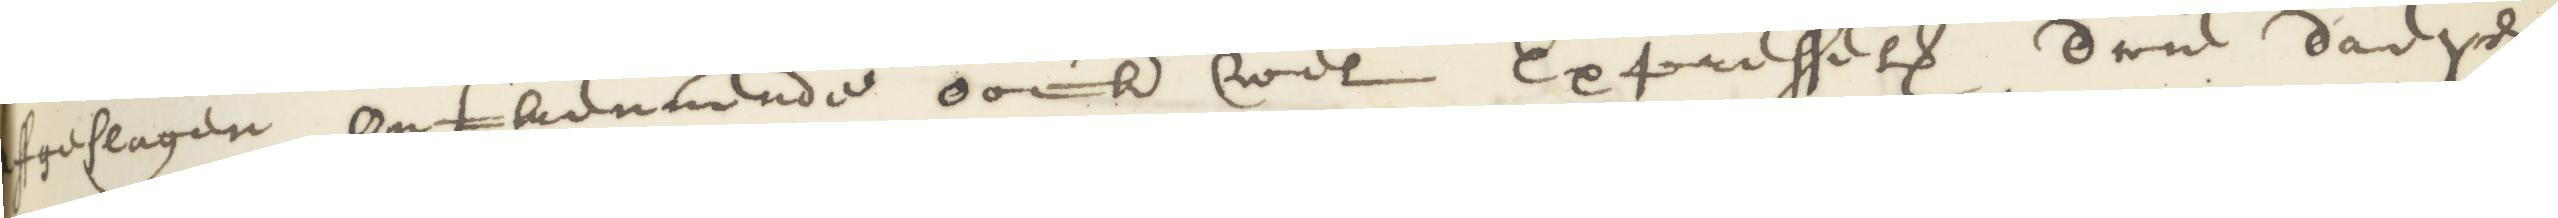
ffgeslagen ontkennende oock wel Expresselijk drie daegen
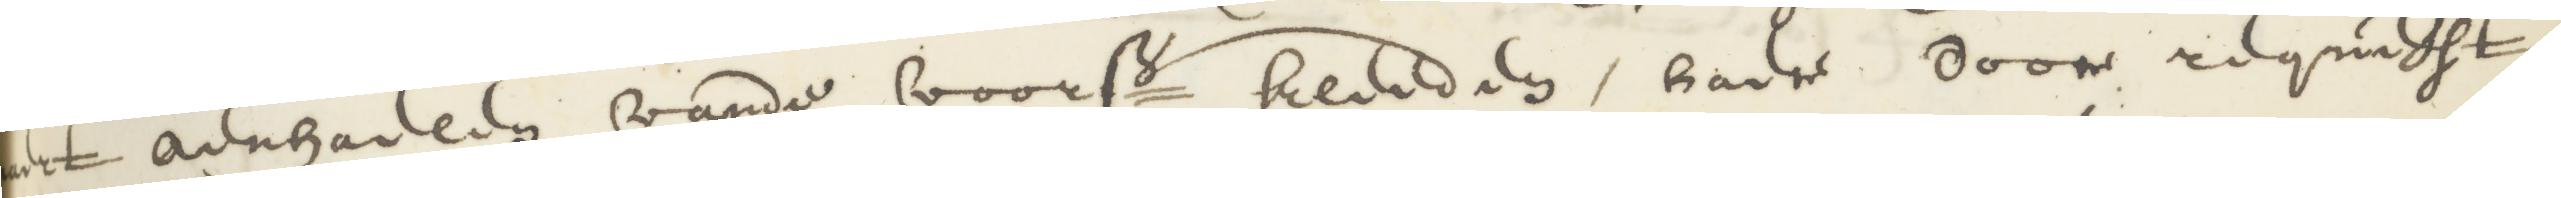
ert aenhaelen vande voors=z kleeden, haer door request
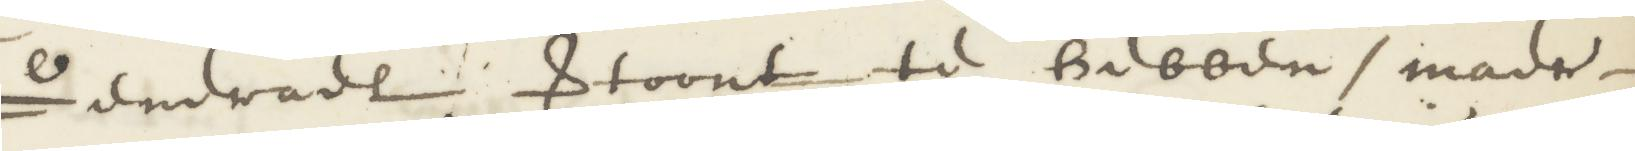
Generael vertoont te hebben, maer
